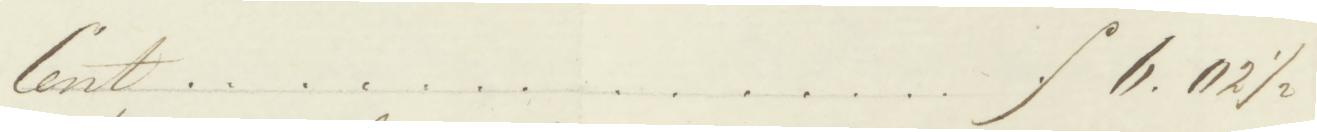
Cent . . . . . . . . . . . . . . . ƒ 6.02½
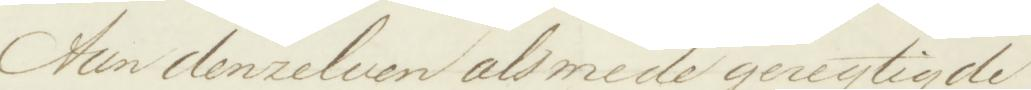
Aan denzelven als mede geregtigde
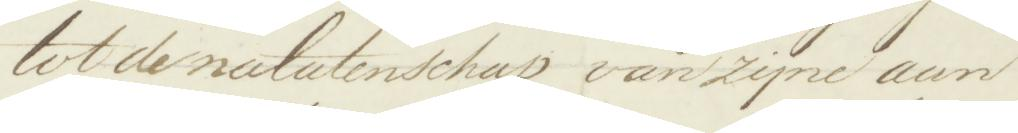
tot de nalatenschap van zijne aan
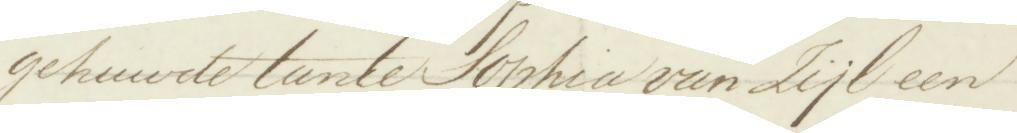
gehuwde tante Sophia van Zijl een
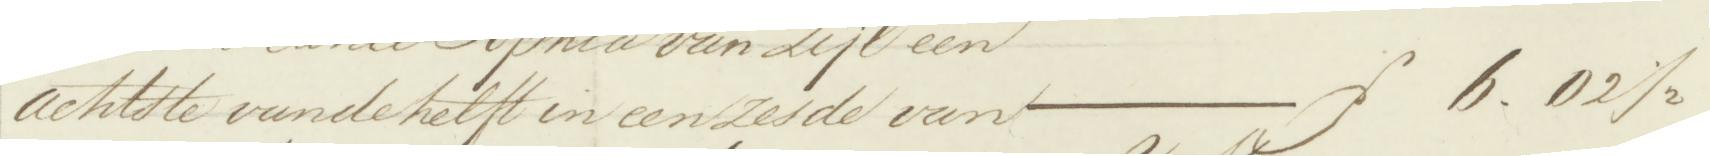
achtste van de helft in een zesde van ƒ 6.02½
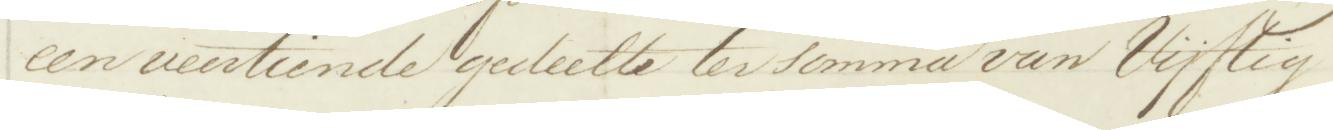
een veertiende gedeelte ter somma van Vijftig
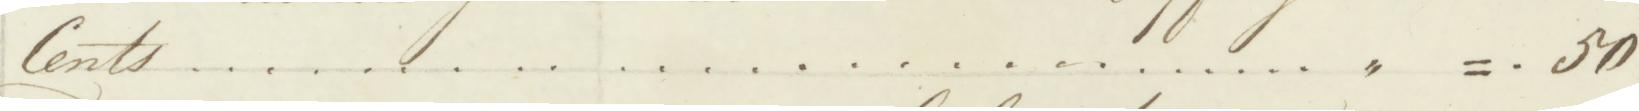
Cents . . . . . . . . . . . . . . . . . . . . . . . . . . „ —. 50
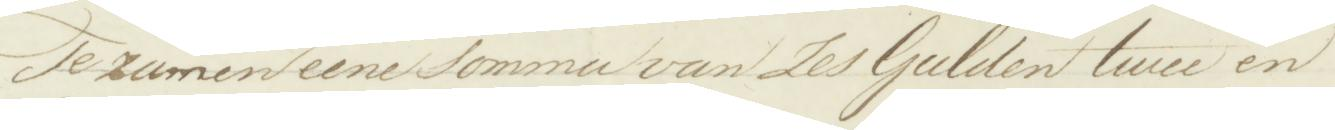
Te zamen eene somma van Zes Gulden twee en
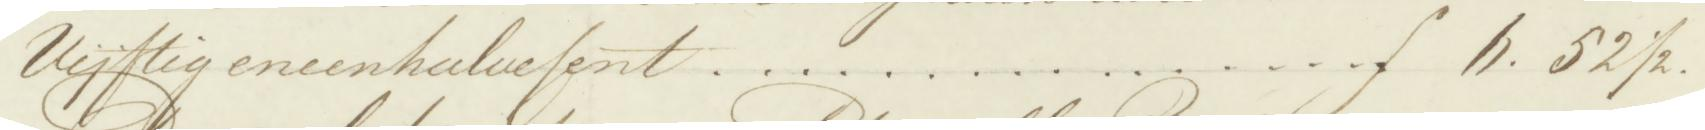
Vijftig en een halve Cent. . . . . . . . . . . . . - - - ƒ 6.52½.
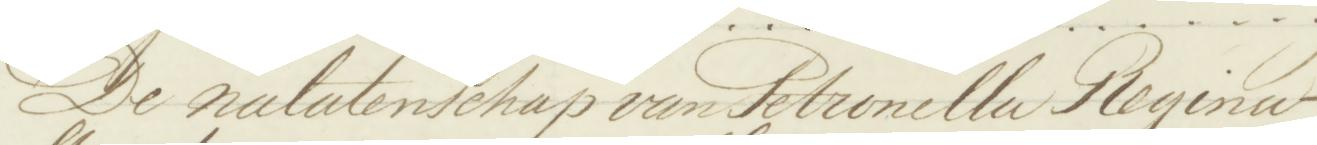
De nalatenschap van Petronella Regina
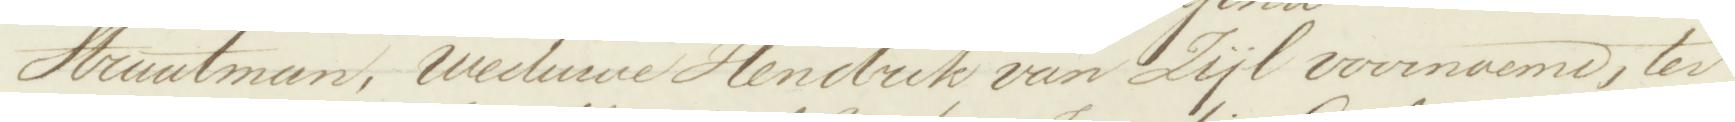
Straatman, weduwe Hendrik van Zijl voornoemd, ter
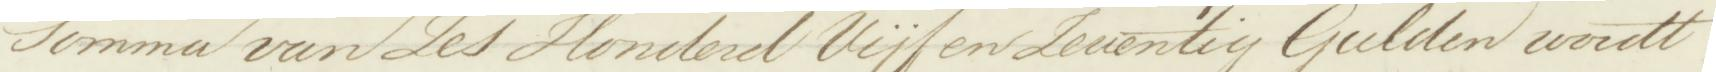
somma van Zes Honderd Vijf en Zeventig Gulden wordt
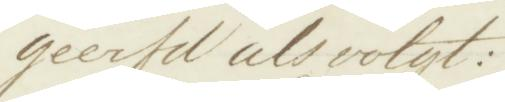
geerfd als volgt:
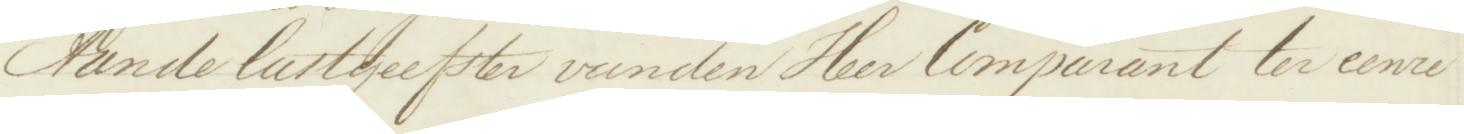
Aan de lastgeefster van den Heer Comparant ter eenre
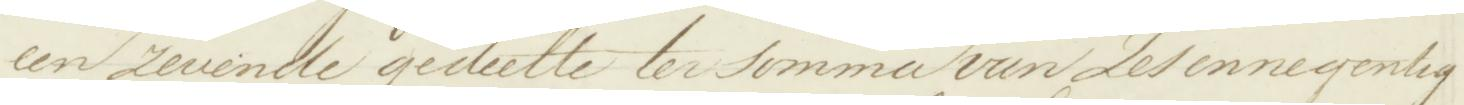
een zevende gedeelte ter somma van Zes ennegentig
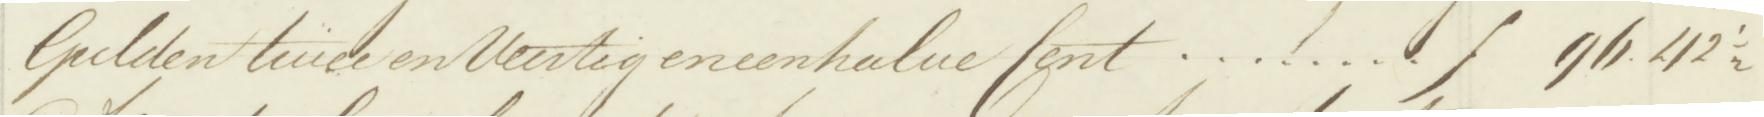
Gulden twee en Veertig en een halve Cent . . . . . . . . ƒ 96.42½
